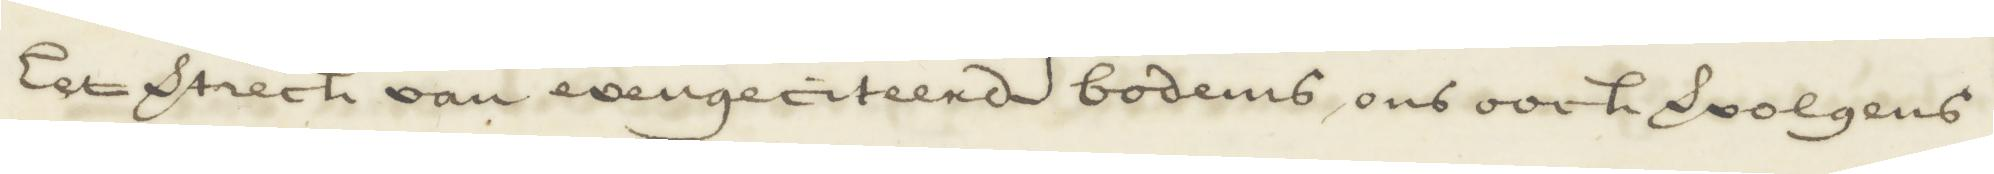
het vertreck van evengeciteerde bodems, ons oock vervolgens
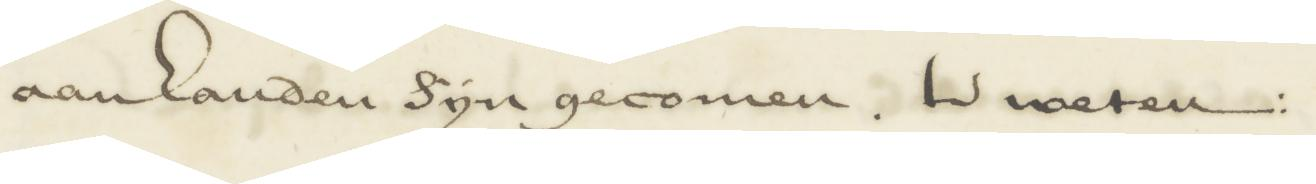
aan landen sijn gecomen. te weten:
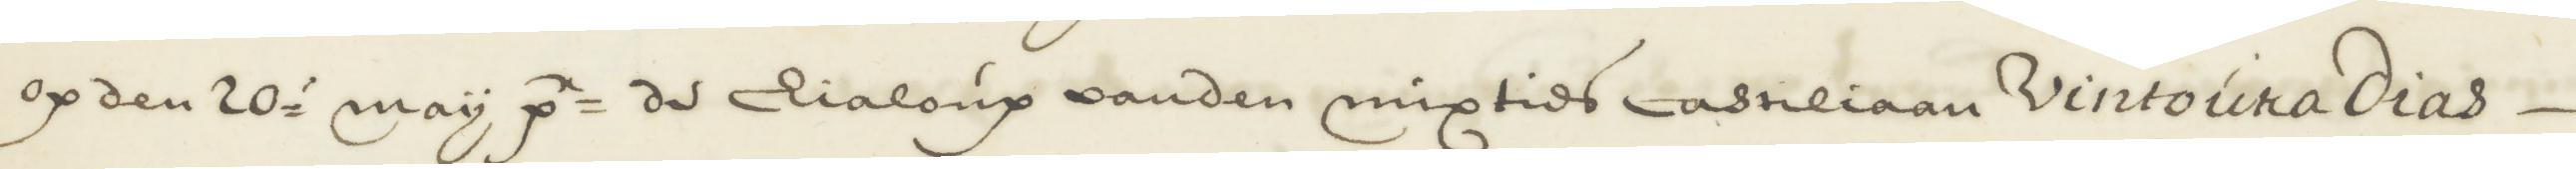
op den 20=' maij p=r de chialoup van den mixties castiliaan Vintoura dias —
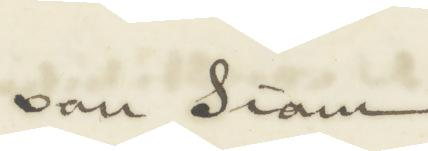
van Siam
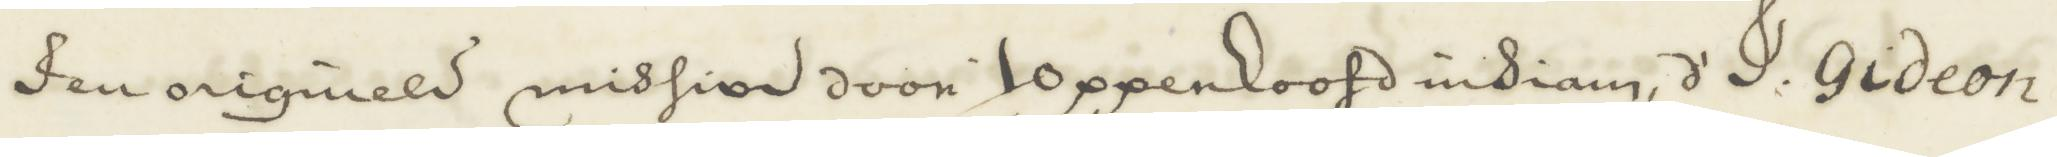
Een originele missive door 't opperhoofd in siam, d’ E: Gideon
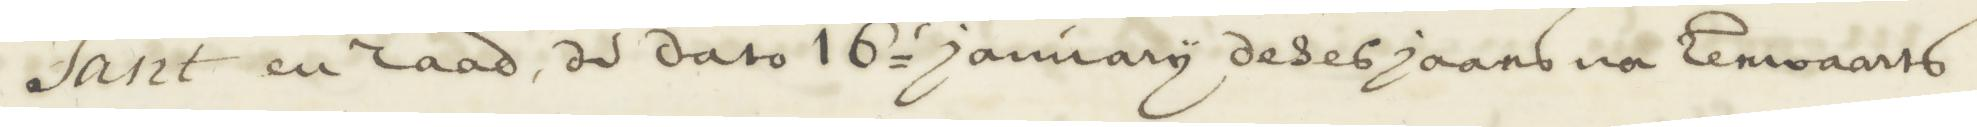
Tant en raad, de dato 16=' januarij deses jaars na herwaarts
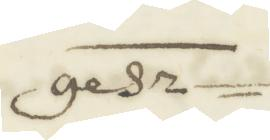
gesz=
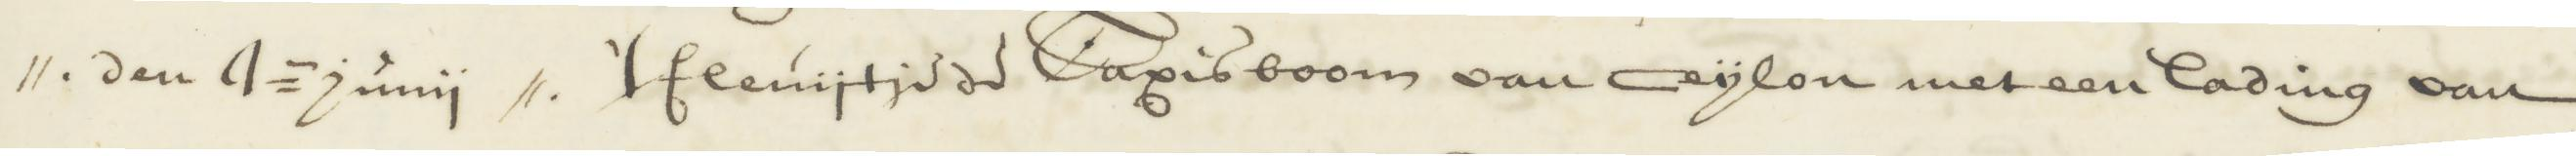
„. den 4=' junij „. ’t fleuijtje de Taxisboom van ceijlon met een lading van
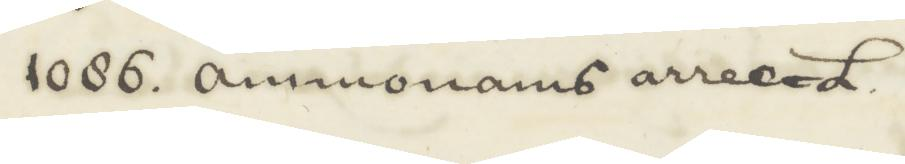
1086. ammonams arreeck.
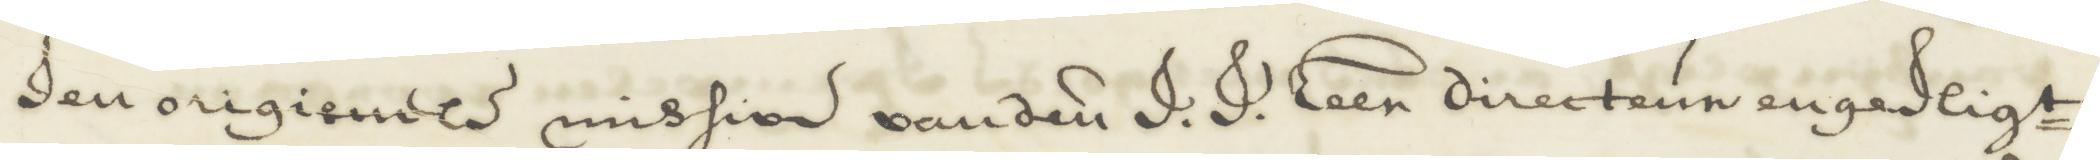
Een origienele missive van den E: E: heer directeur en geElig=t
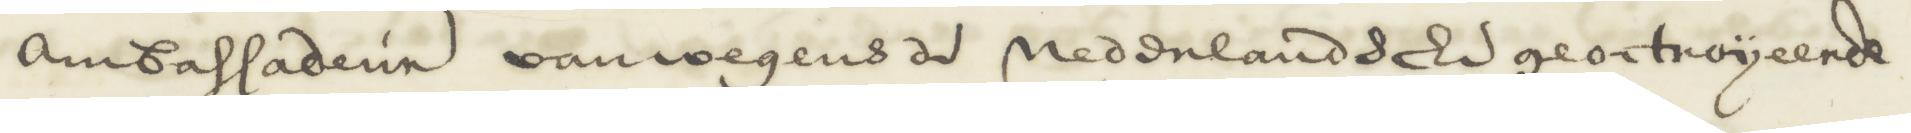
Ambassadeur van wegens de nederlandsche geoctroijeerde
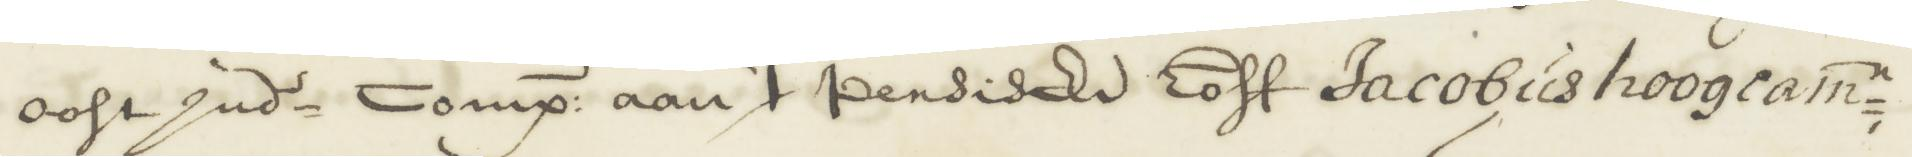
oost jnd=e Comp: aan ’t persische hoff Iacobus hoogcam=r,
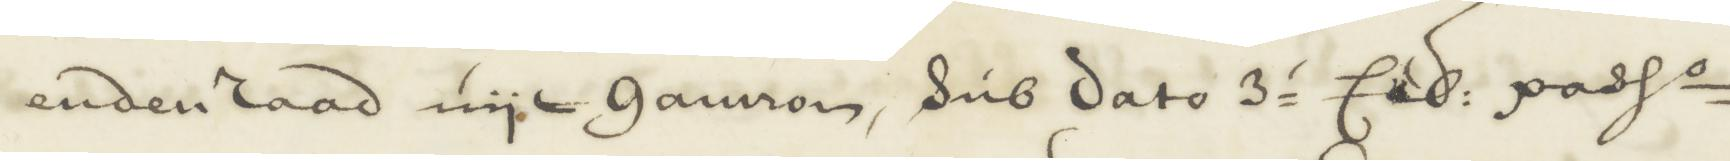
en den raad uijt gamron, sub dato 3=' feb: pass=o
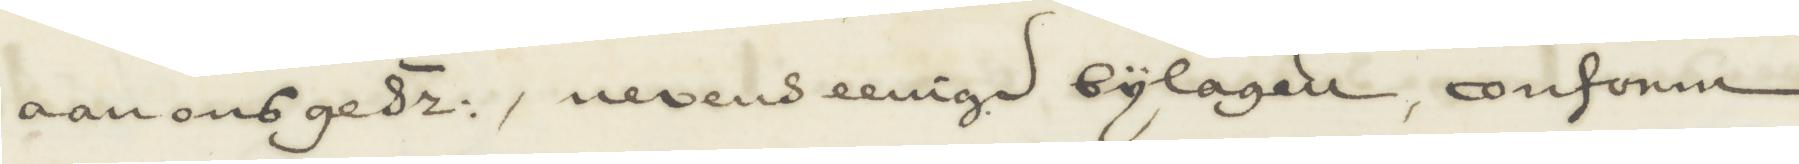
aan ons gesz:, nevens eenige bijlagen, conform
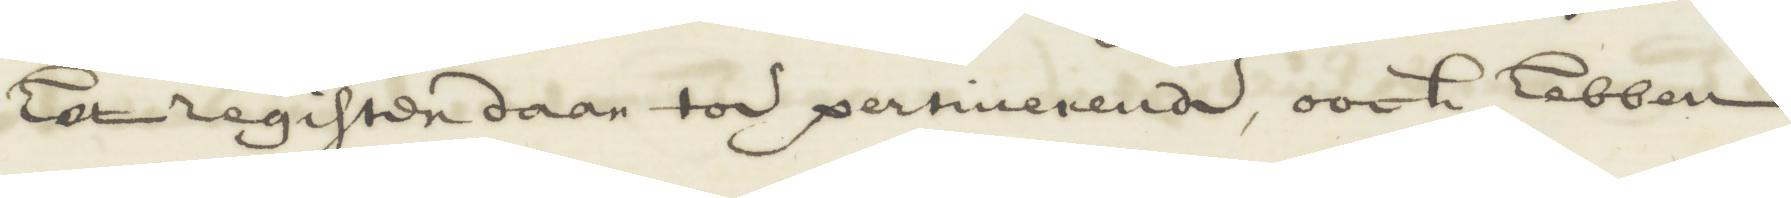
het register daar toe pertinerende, oock hebben
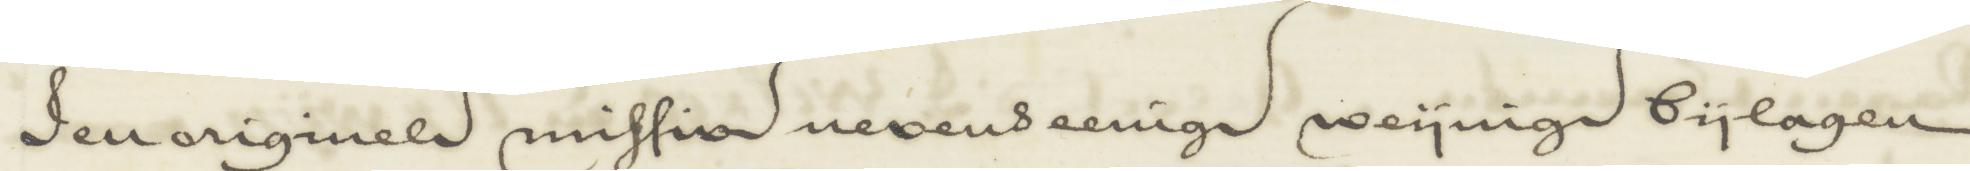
Een originele missive nevens eenige weijnige bijlagen
